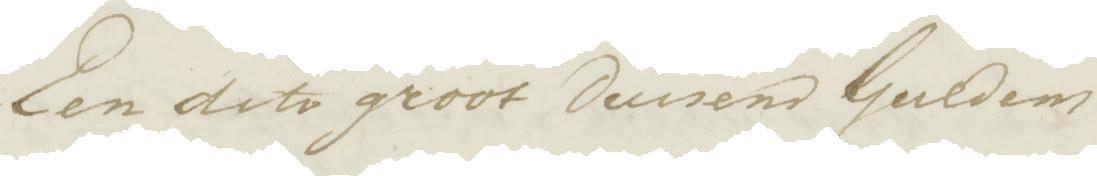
Een dito groot Duisend Guldens
